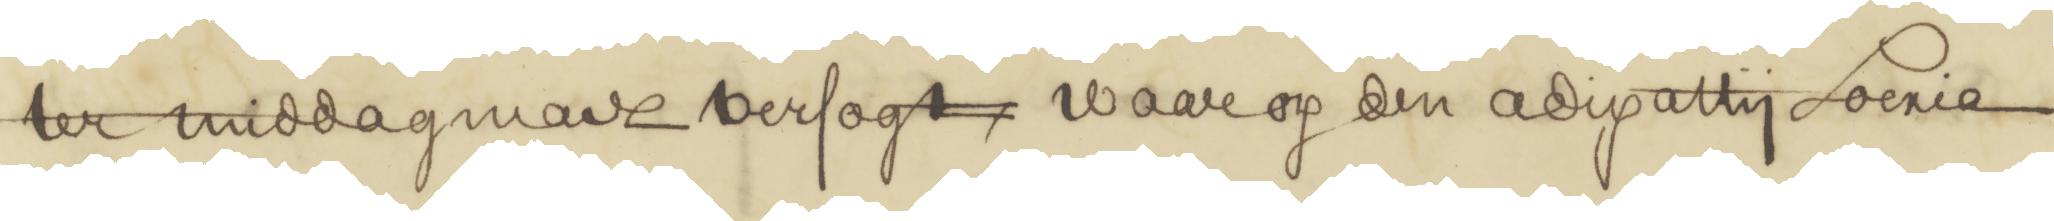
ter middagmael versogt, waar op den adipattij soeria
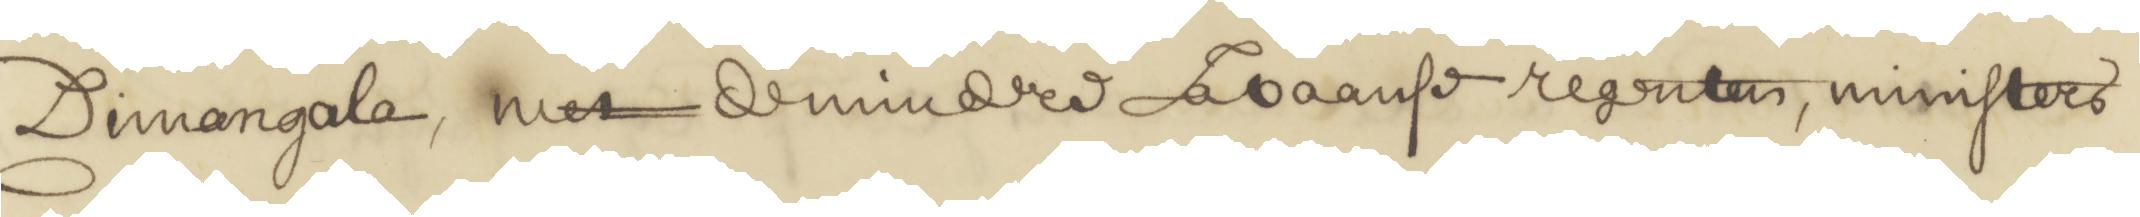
Dimangala, met de mindere Iavaanse regenten, ministers
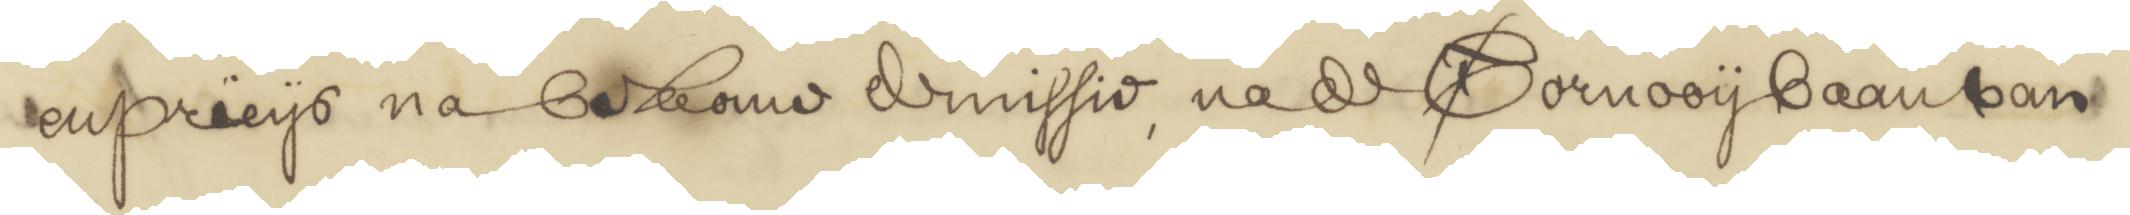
en prieijs na bekome demissie, na de Tornooijbaan van
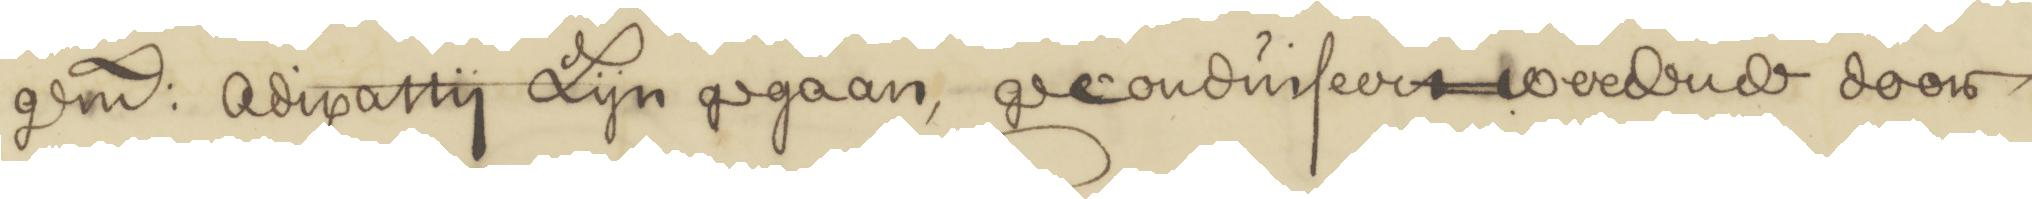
gem: adipattij zijn gegaan, geconduiseert werdende door
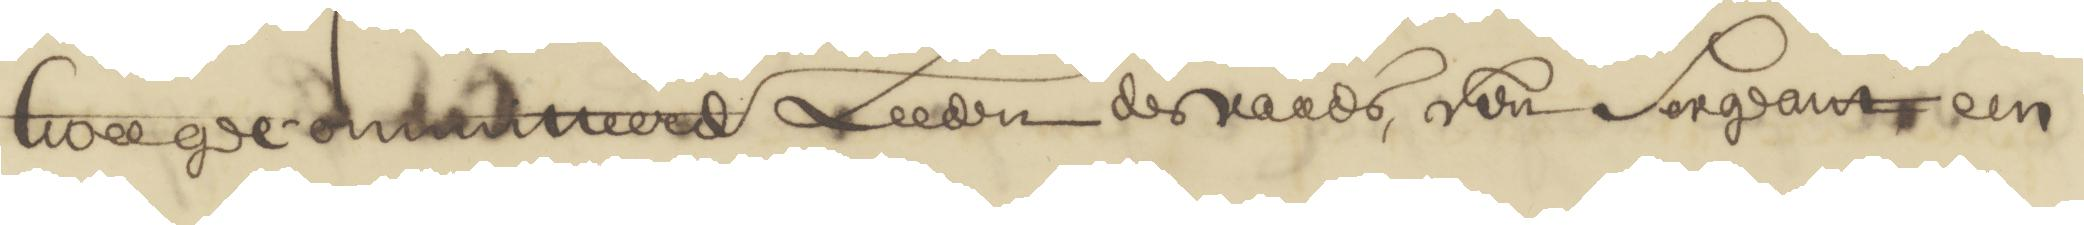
twee gecommitteerde Leeden des raads, Een sergeant een
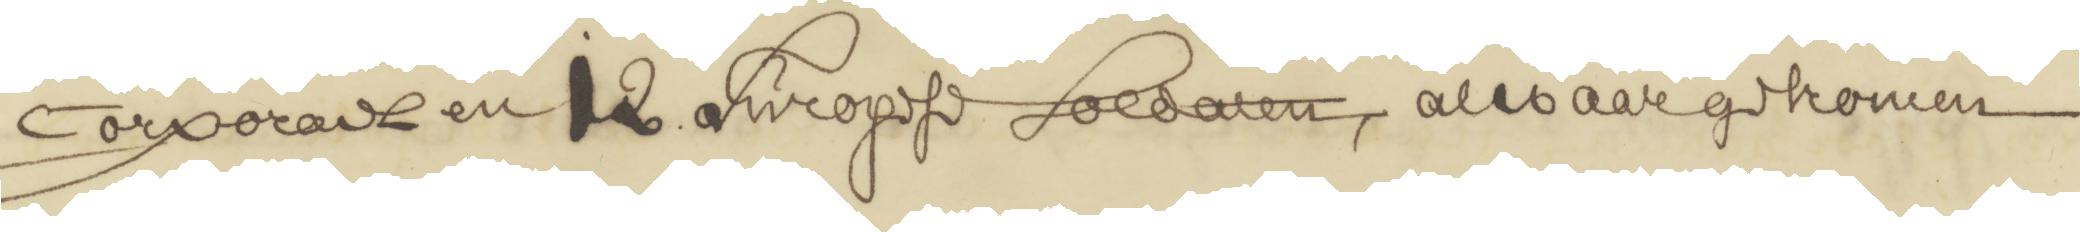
Corporael en 12. Europese soldaten, alwaar gekomen
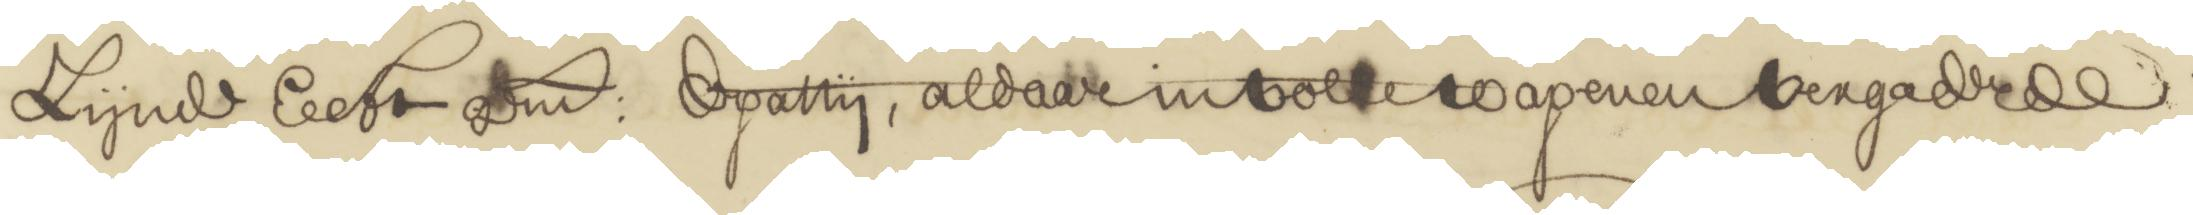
zijnde heeft gem: depattij, aldaar in volle wapenen vergaderde
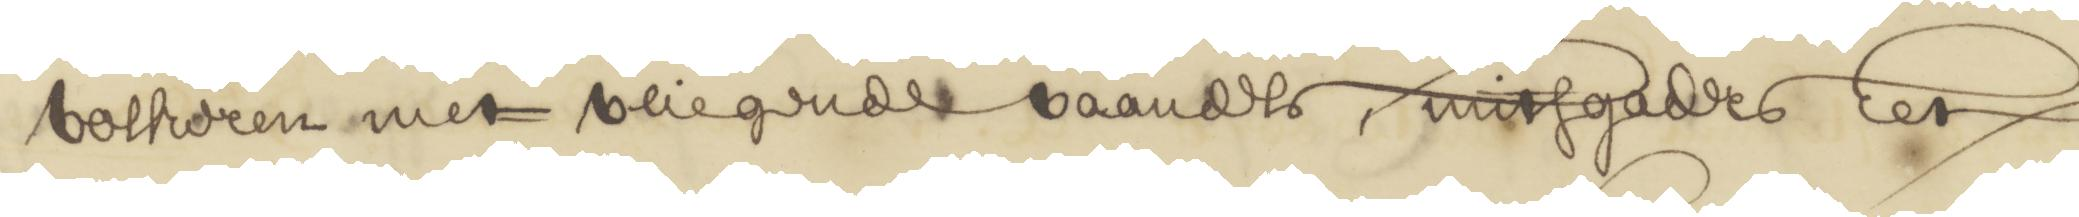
volkeren met vliegende vaandels, mitsgaders het
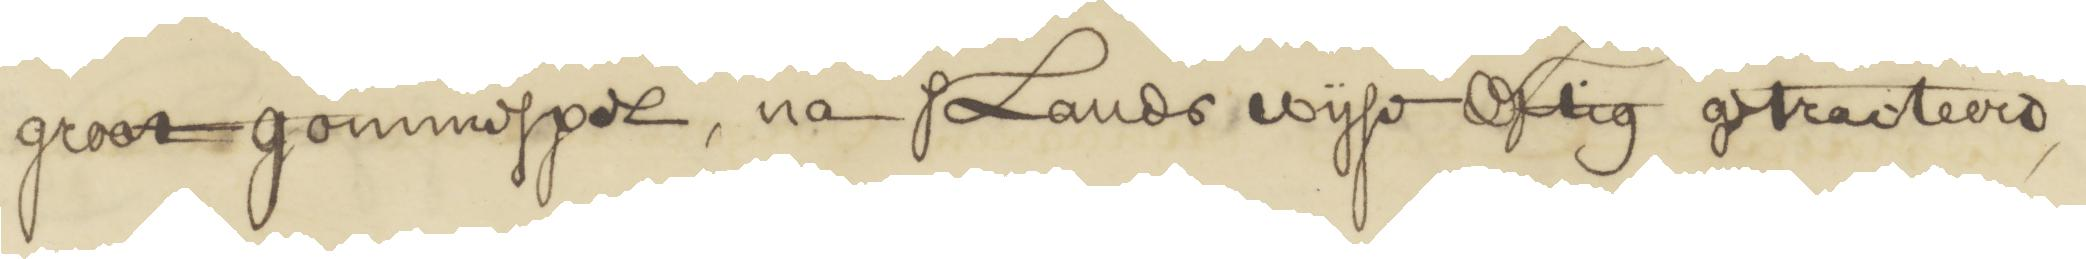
groot gommespel, na sLands wijse deftig getracteerd,
